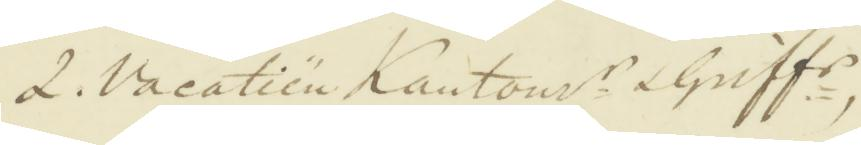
2. Vacatiën Kantonr=r en Griff=r
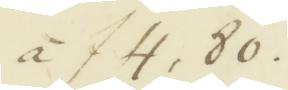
à ƒ 4, 80.
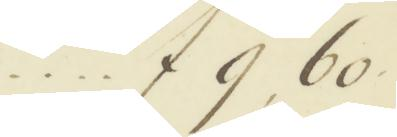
- - - - ƒ 9 ,60
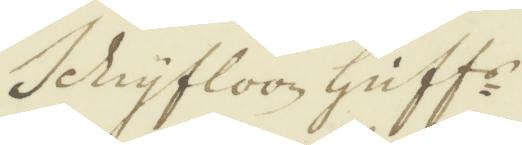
Schrijfloon Griff=r
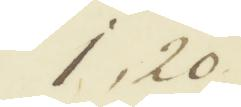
1 ,20
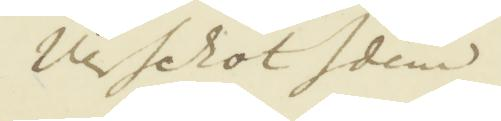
Veschot Idem
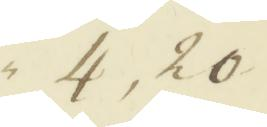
„ 4 ,20
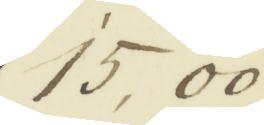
15, 00
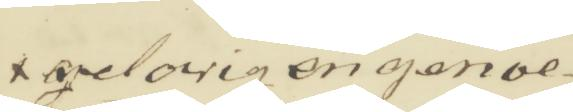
x gelovig en genoe
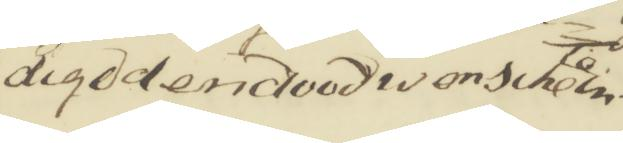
digd den dood wensche in te
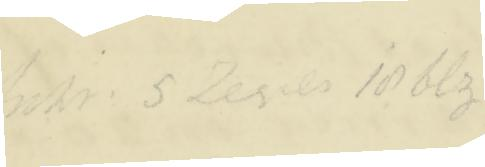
Afschr. 5 Zegels 18 blz
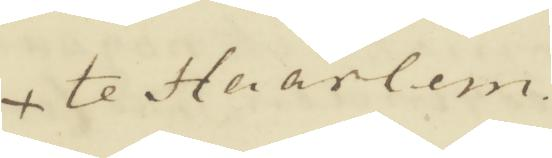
x te Haarlem
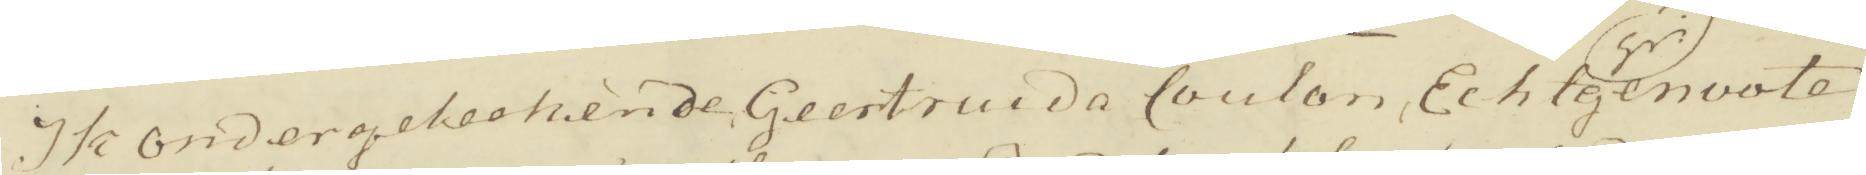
Ik ondergeteekende Geertruida Coulon, Echtgenoote
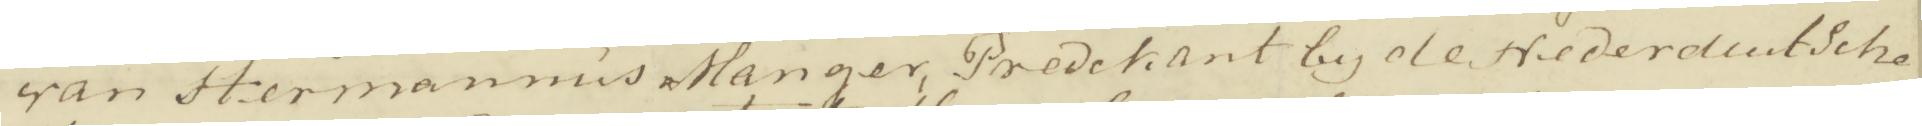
van Hermannus Manger Predikant by de Nederduitsche
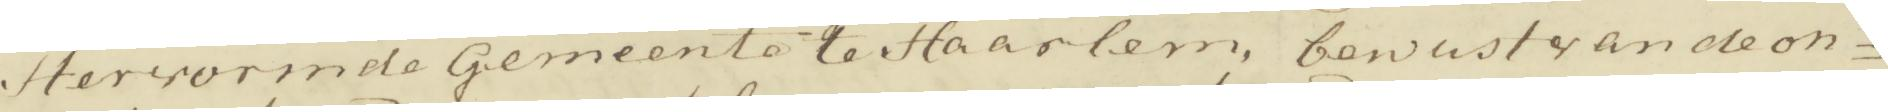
Hervormde Gemeente te Haarlem, bewust van de on=
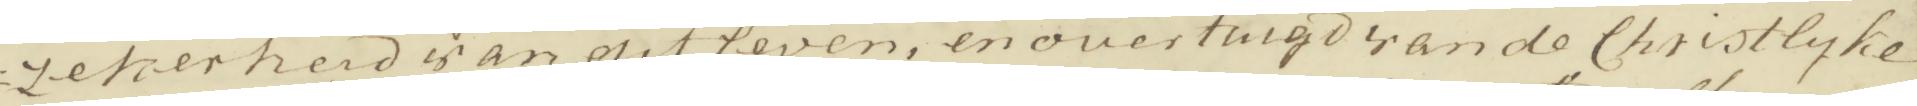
„zekerheid van dit leven, en overtuigd van de Christlyke
